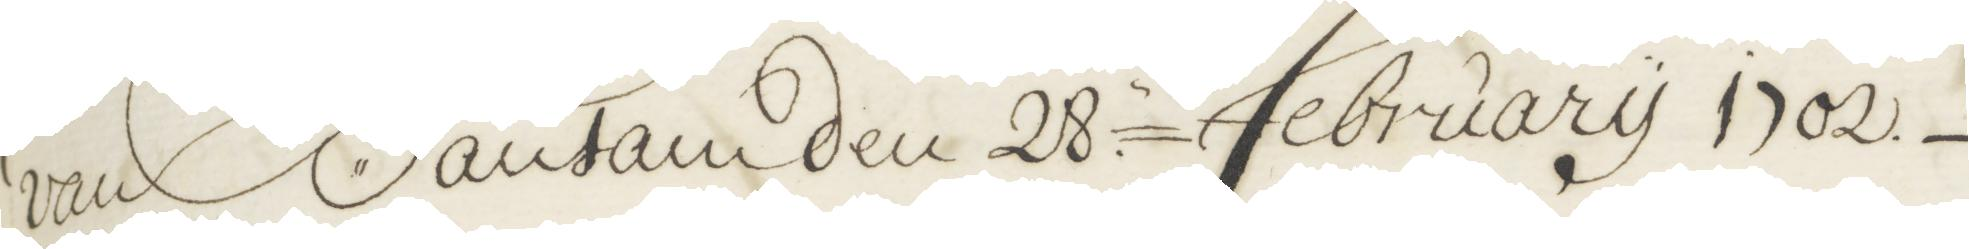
van Bantam den 28.=n Februarij 1702. _
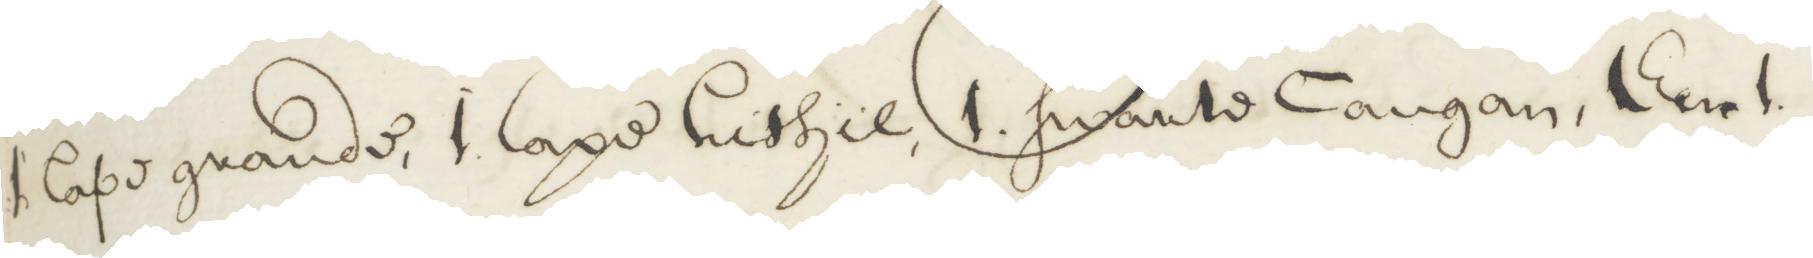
1. tape grande, 1 tape kitsjil, 1. swarte Cangan, Een 1.
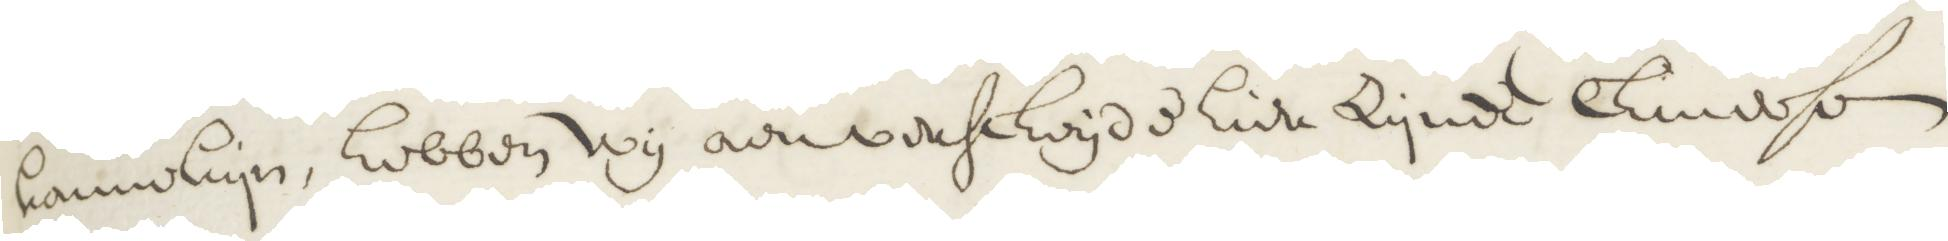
kannekijn, hebben wij aen verscheijde hier zijnde Chineese
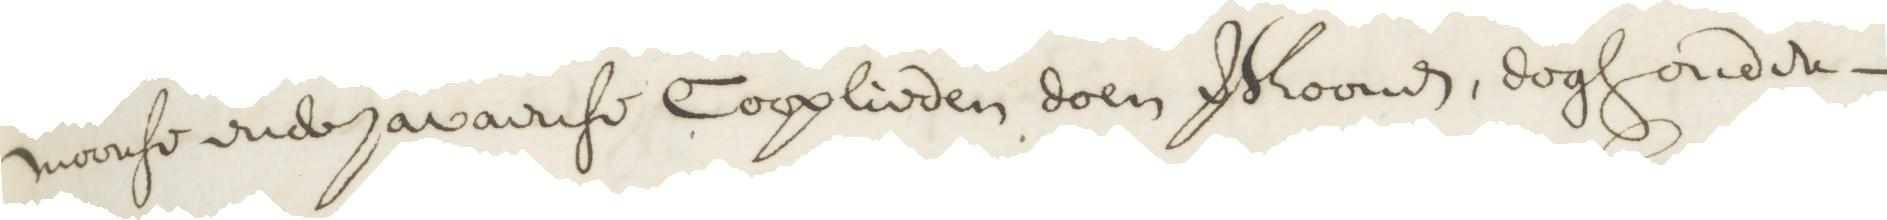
moorse ende javaense Cooplieden doen verthoonen, dogh onder
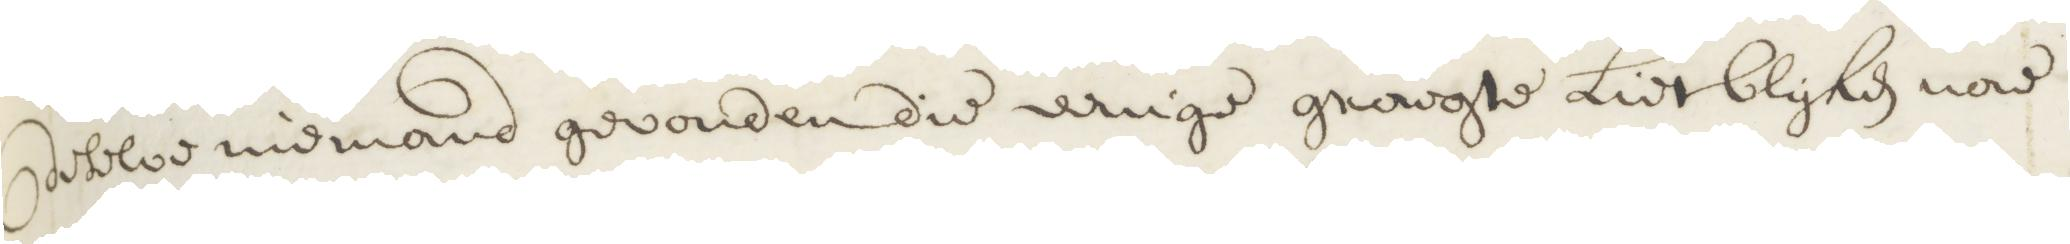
deselve niemand gevonden die eenige graegte liet blijken nae
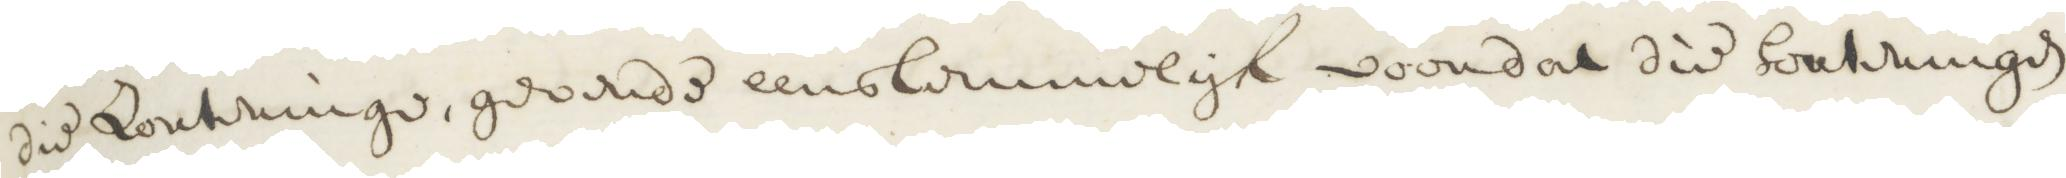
die zorteringe, gevende eenstemmelijk voor dat die sorteringen
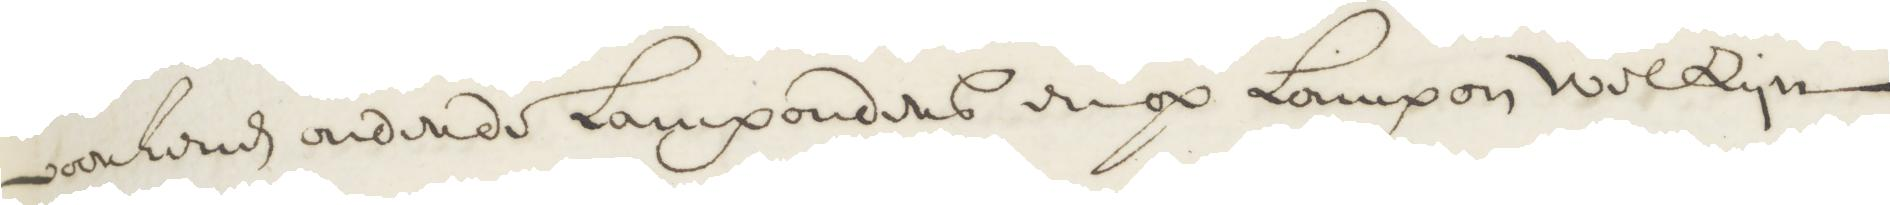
voorhenen onder de Lamponders en op Lampon wel zijn
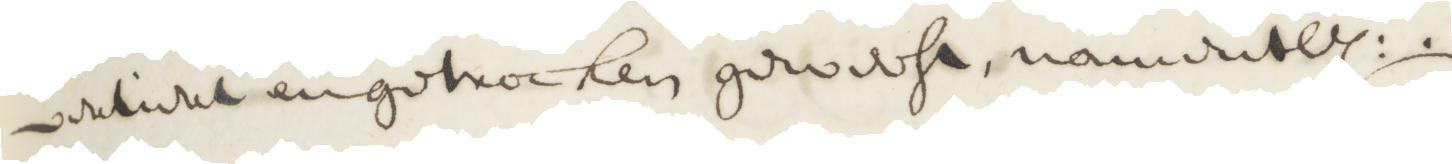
vertiert en getrocken geweest, namentlijk:.
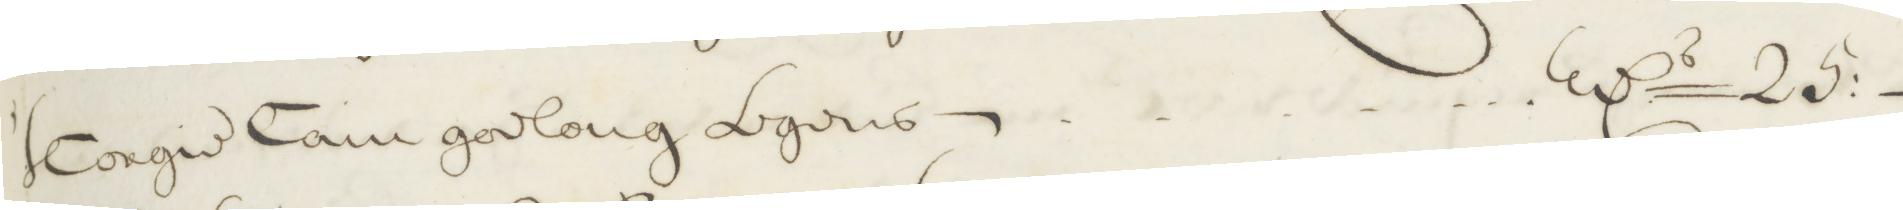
'tCorgie Cam goelong tegens . . . . . . . rd=s 25:
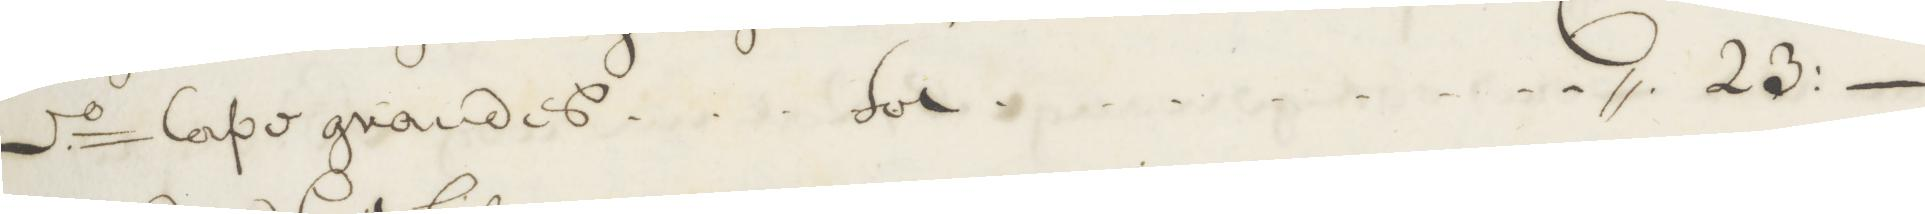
_=o tape grandes . . . tot . . . . . . . . „ . 23: _
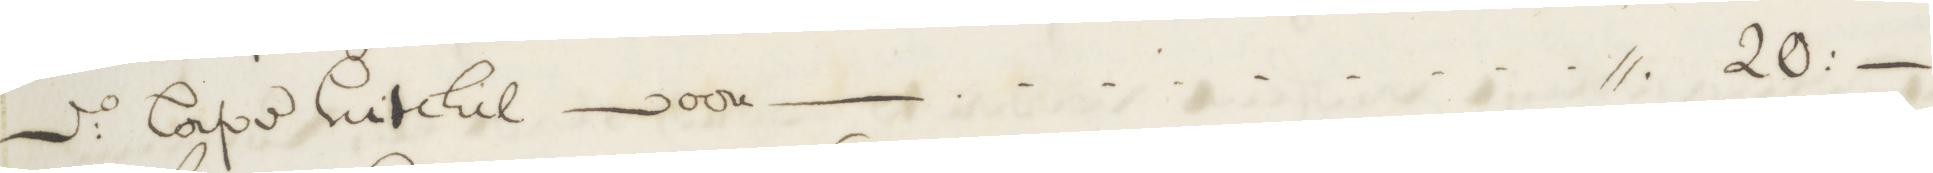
_:o tape kitchil voor . . . . . . . . . „. 20: _
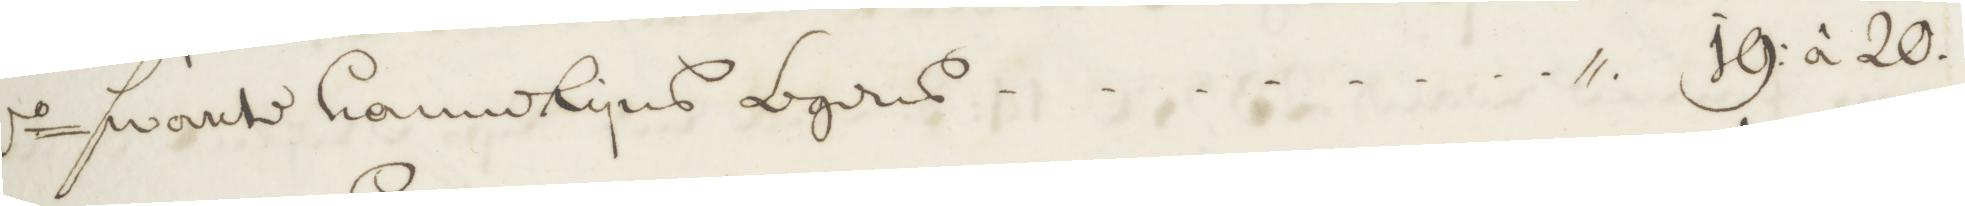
=o swarte kannekijns tegens . . . . . . . . „. 19: à 20.
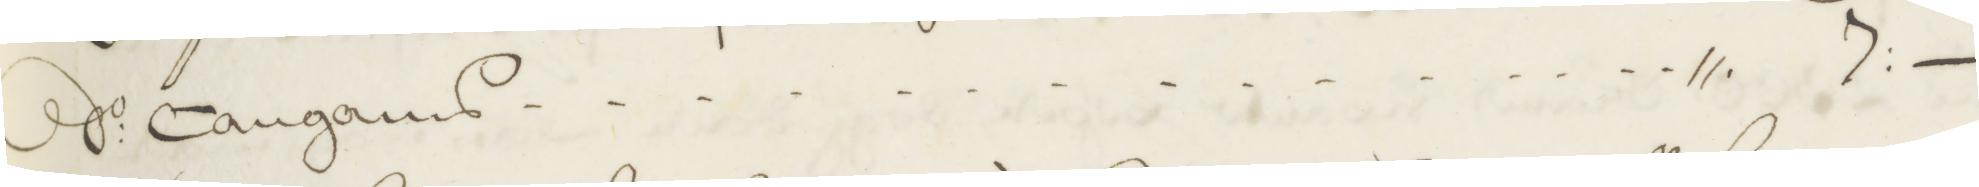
d:o Cangams . . . . . . . . . . . . . . . „. 7: _
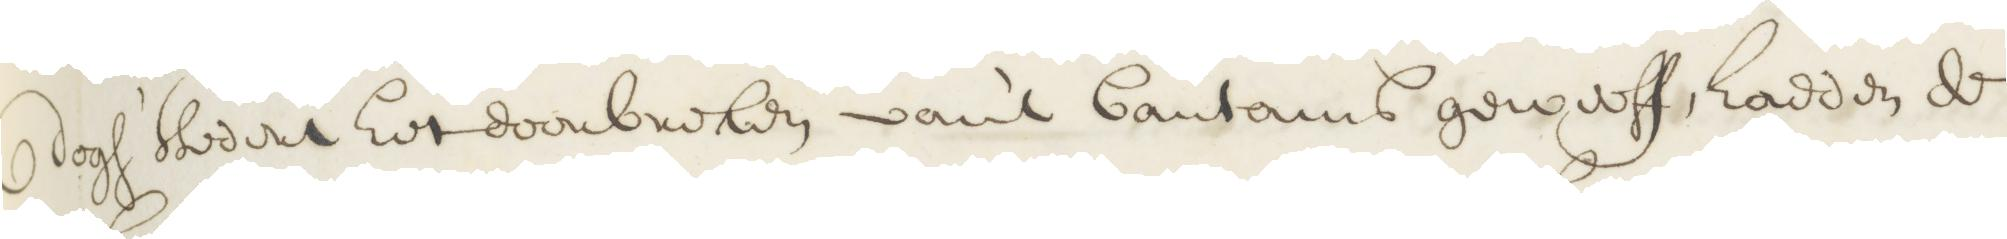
dogh 'tsedert het doorbreken van’t bantams geweeff, hadden de
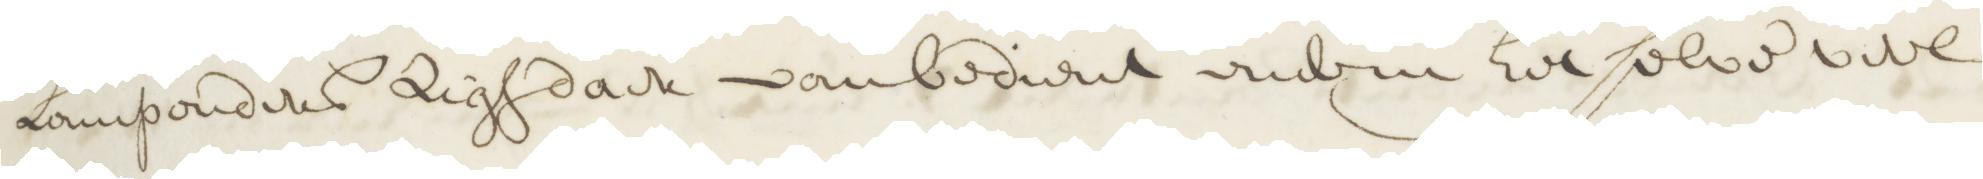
lamponders zigh daer van bedient ende in het selve veel
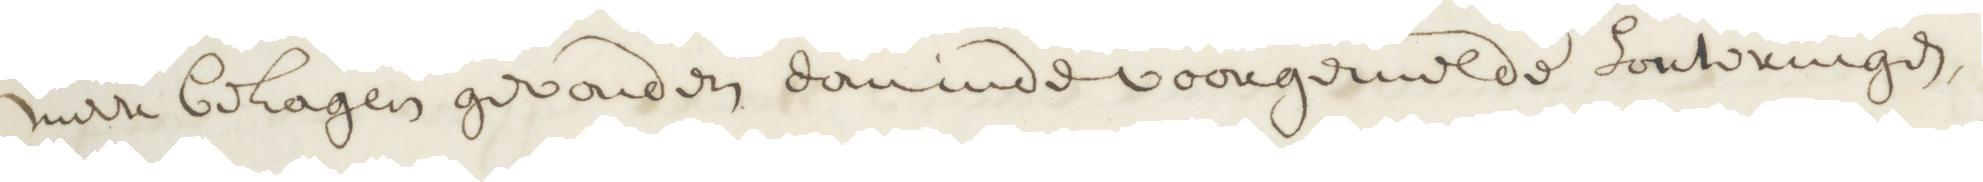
meer behagen gevonden dan in de voorgemelde sorteringen,
